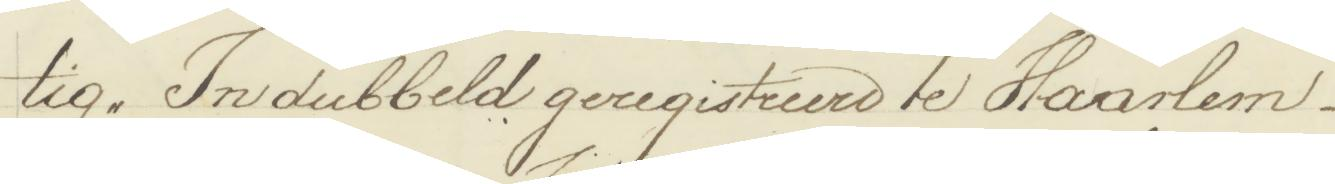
tig„ In dubbeld geregistreerd te Haarlem
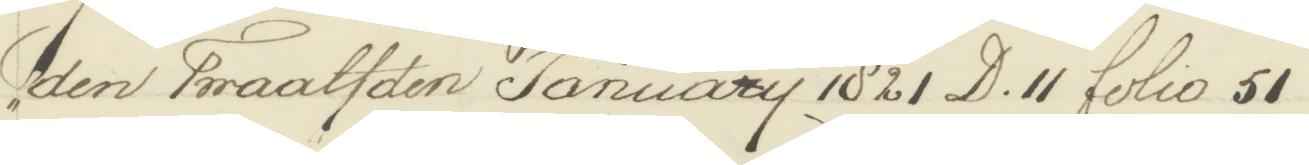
„den Twaalfden Ianuarij 1821 D. 11 folio 51
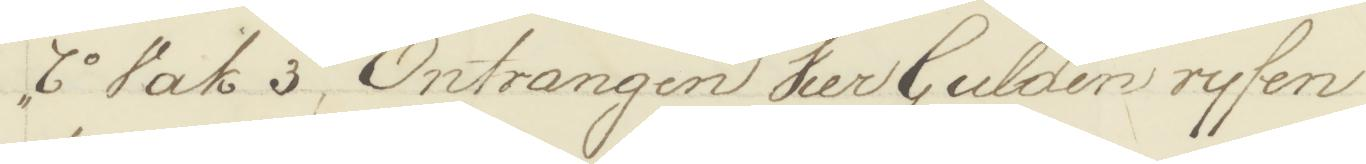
„ro Vak 3, Ontvangen Vier Gulden vyfen
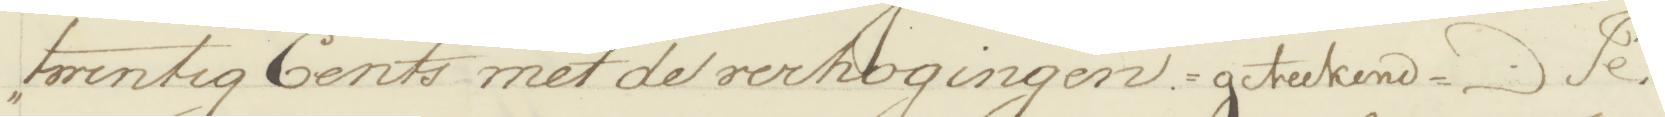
twintig Cents met de verhogingen. = geteekend = D F:
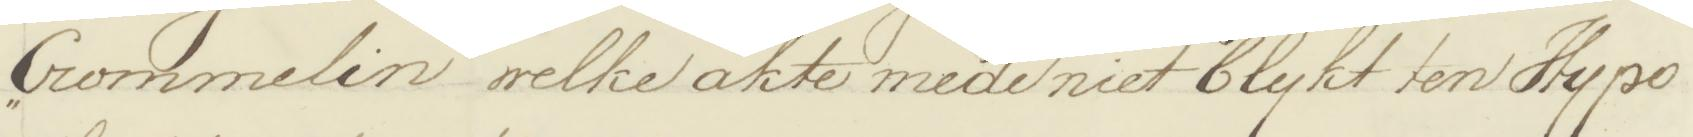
Crommelin" welke akte mede niet blykt ten Hypo
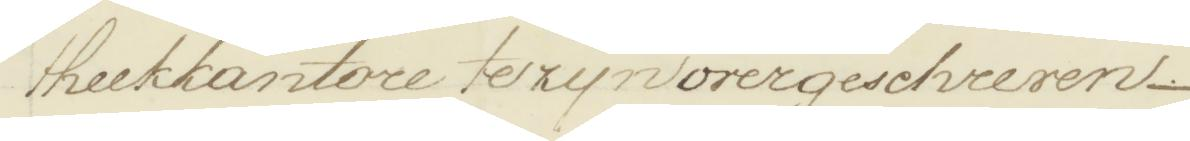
theekkantore te zyn overgeschreven-.
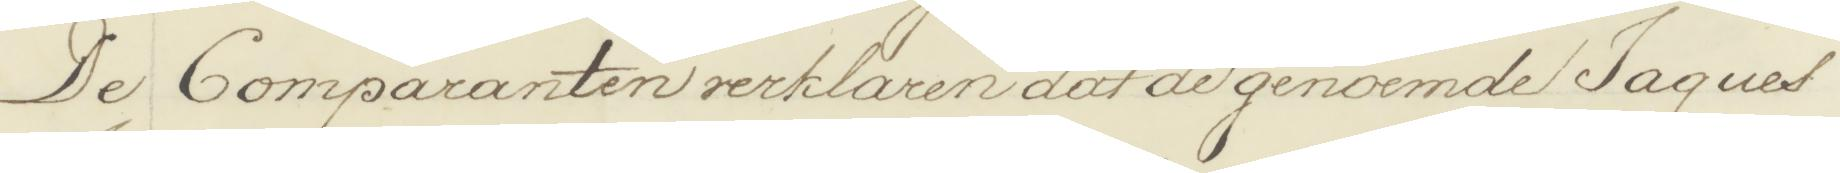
De Comparanten verklaren dat de genoemde Iaques
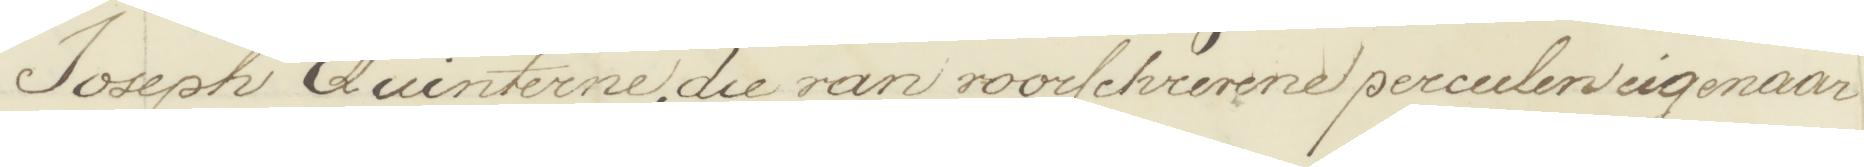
Ioseph Quinterne, die van voorschrevene perceelen eigenaar
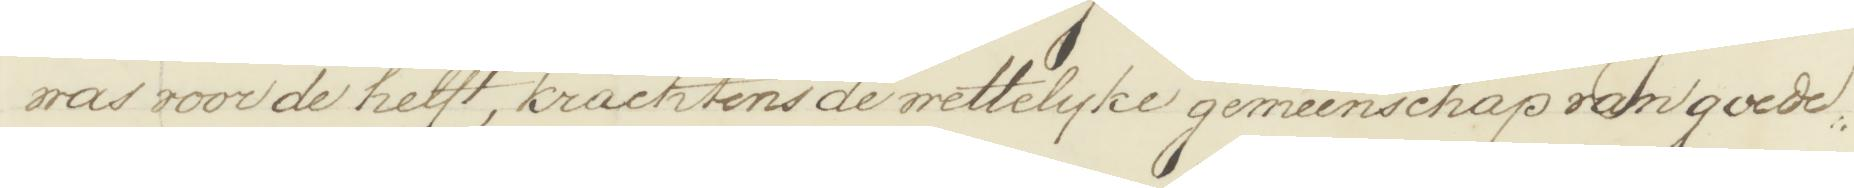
was voor de helft, krachtens de wettelyke gemeenschap van goede„
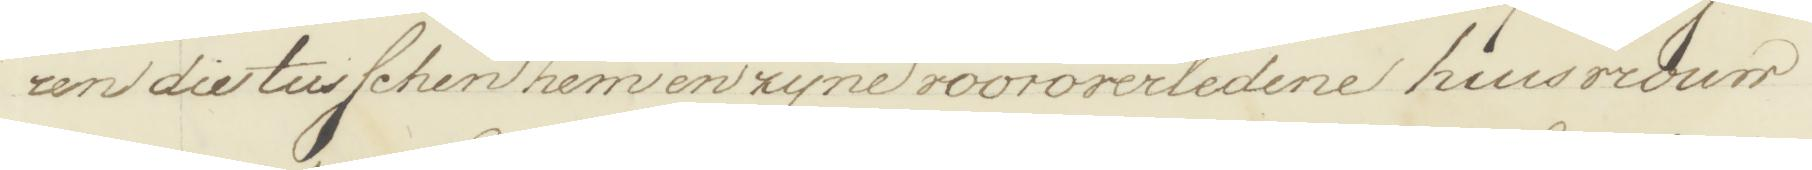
ren die tusschen hem en zyne vooroverledene huisvrouw
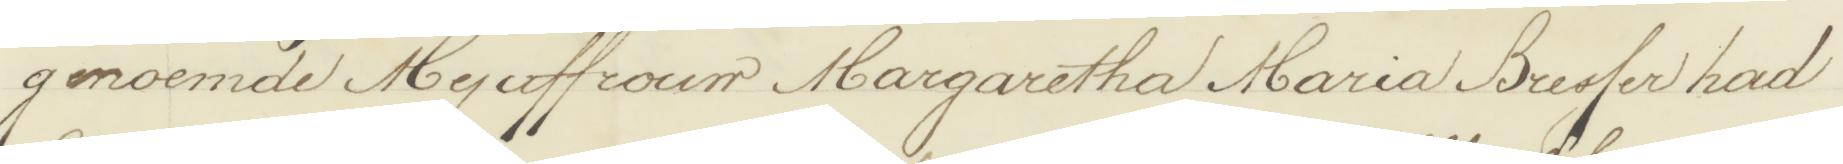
genoemde Mejuffrouw Margaretha Maria Bresser had
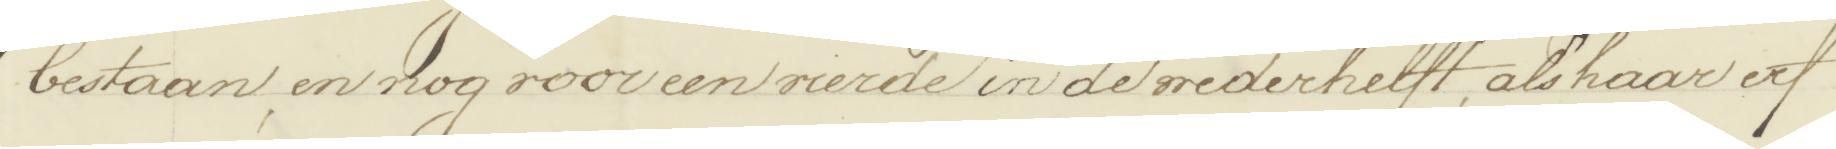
bestaan, en nog voor een vierde in de wederhelft, als haar erf
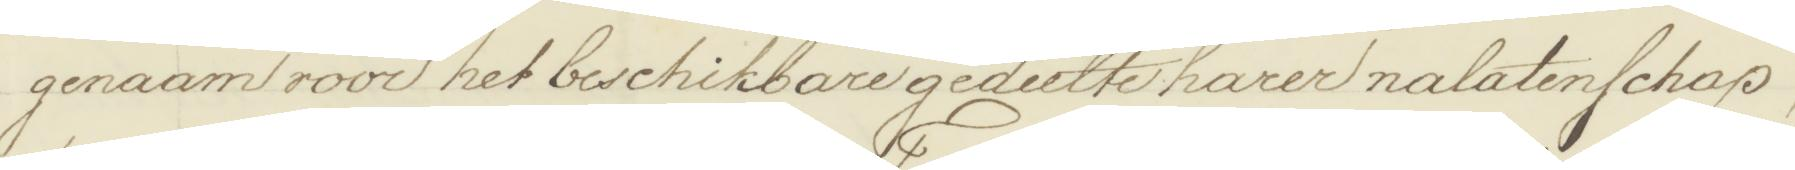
genaam voor het beschikbare gedeelte harer nalatenschap
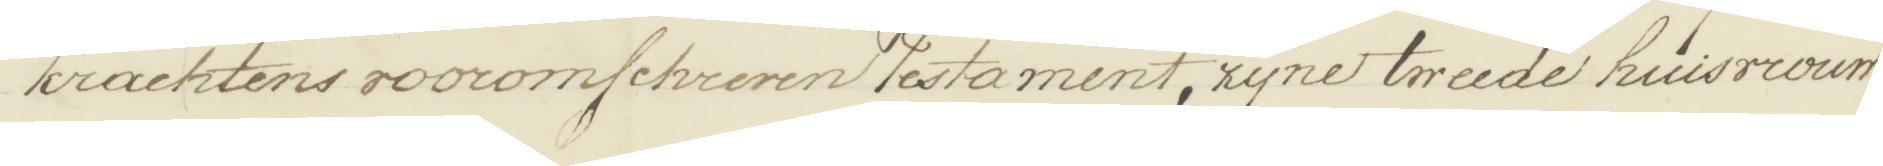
krachtens vooromschreven testament, zyne tweede huisvrouw
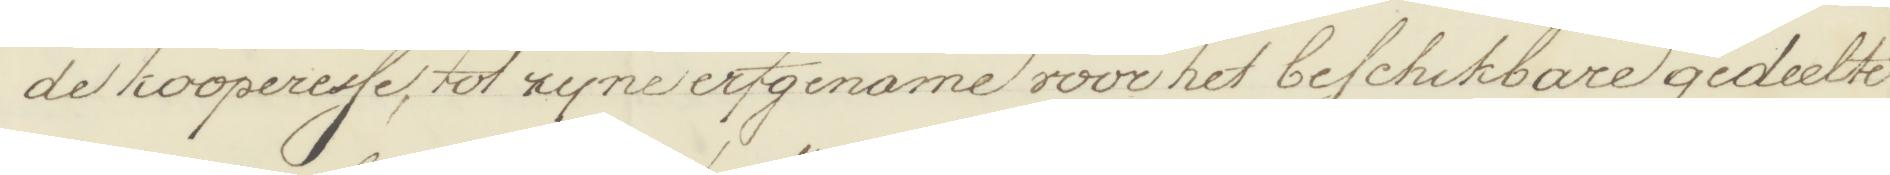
de kooperesse, tot zyne erfgename voor het beschikbare gedeelte
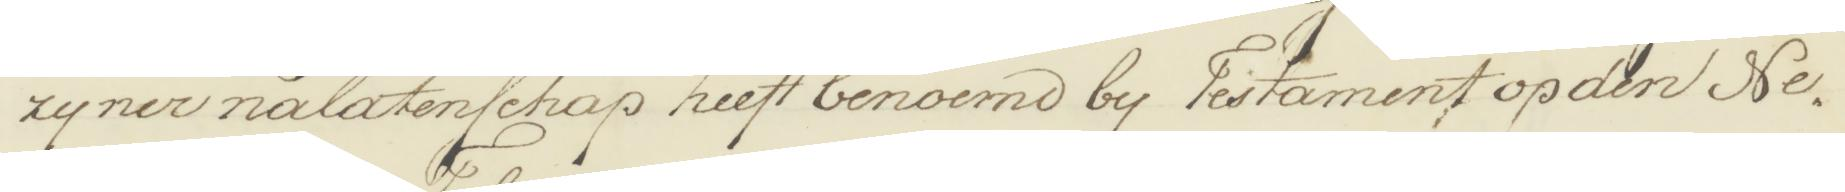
zyner nalatenschap heeft benoemd by Testament op den Ne„
